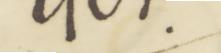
401.
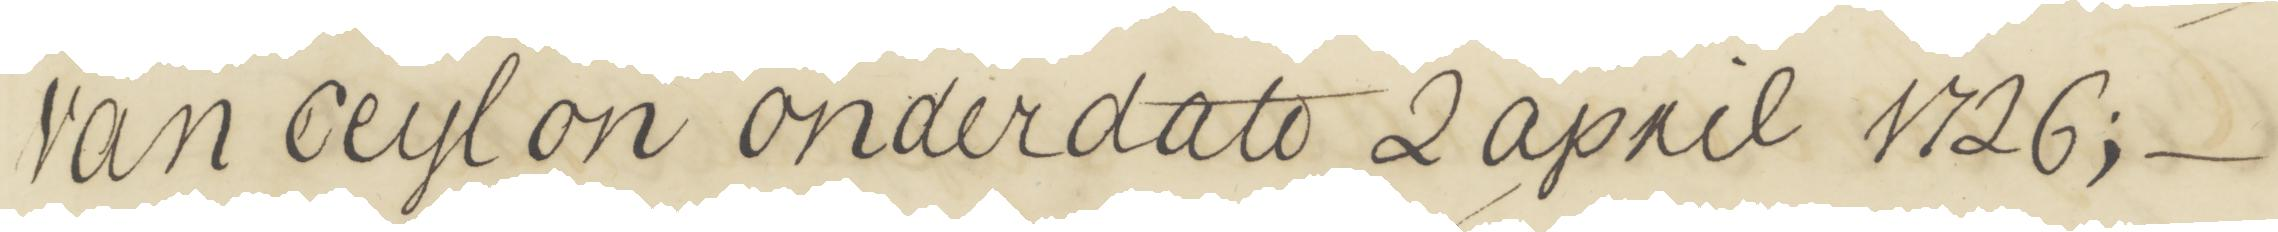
Van Ceylon onder dato 2 april 1726;—
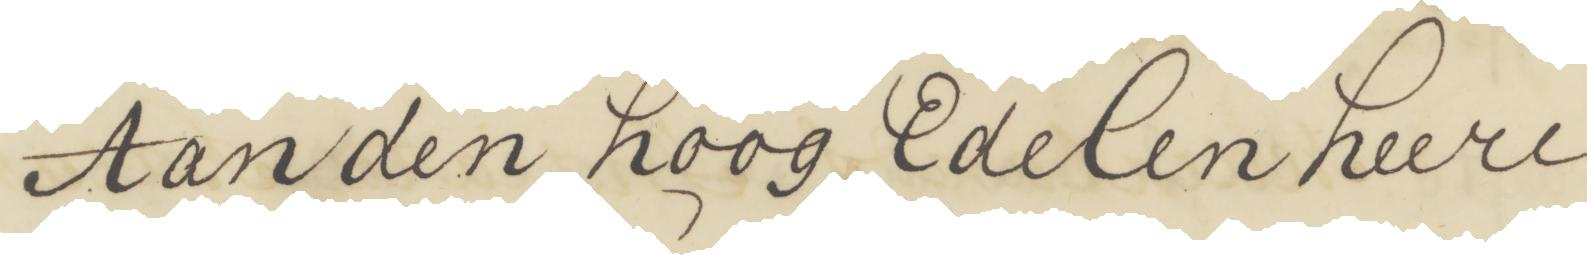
Aan den hoog Edelen heere
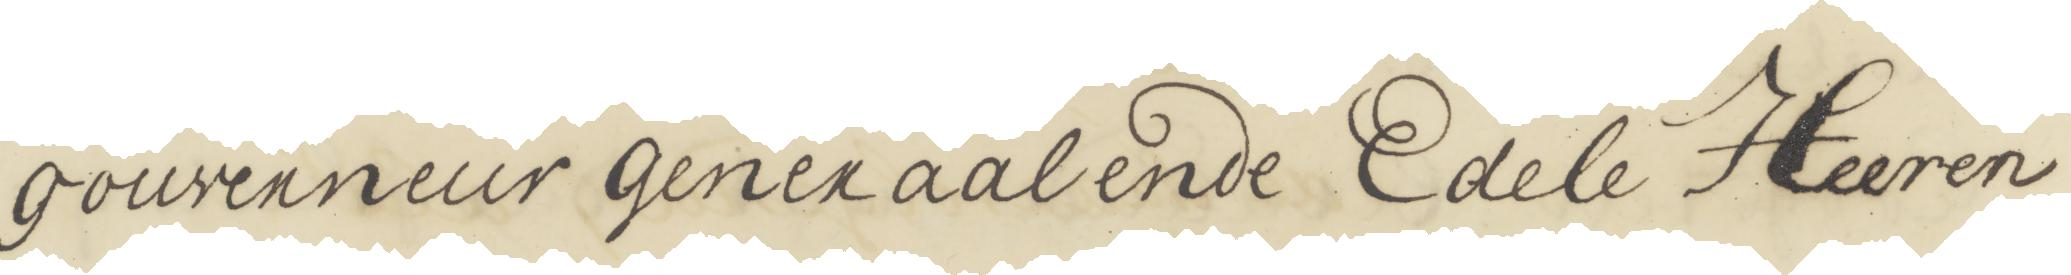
gouverneur generaal ende Edele Heeren
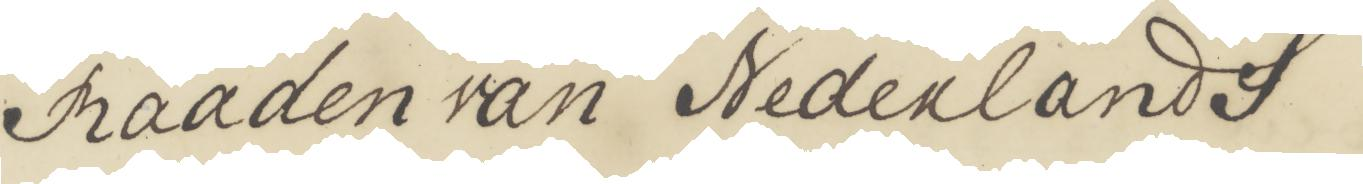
Raaden van Nederlands
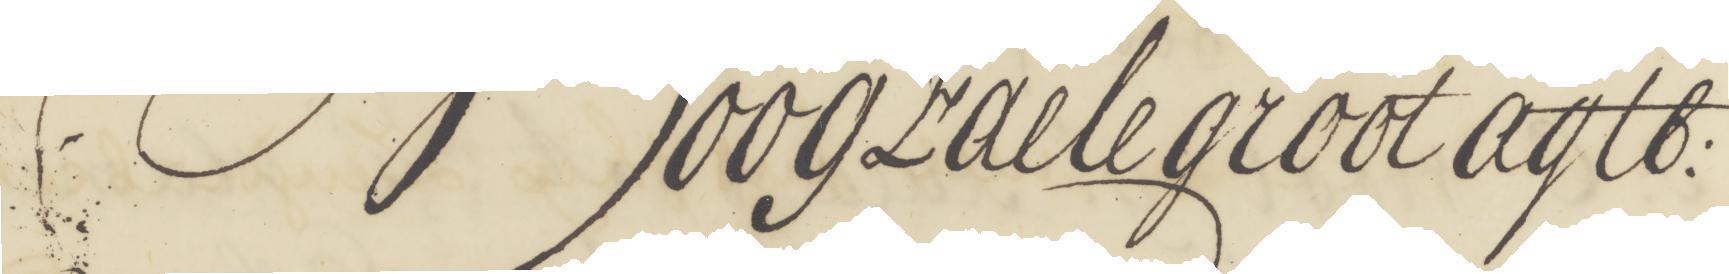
Hoog Edele groot agtb:
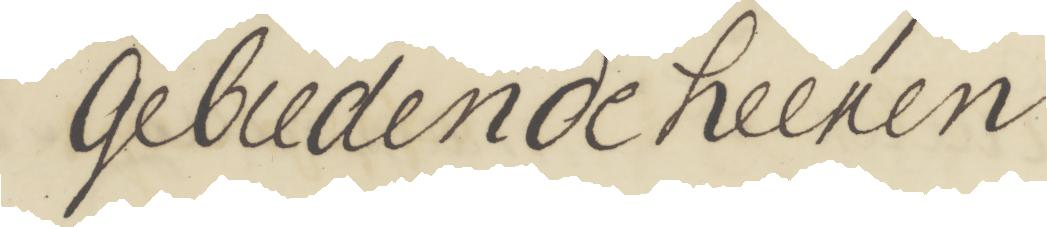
gebiedende heeren
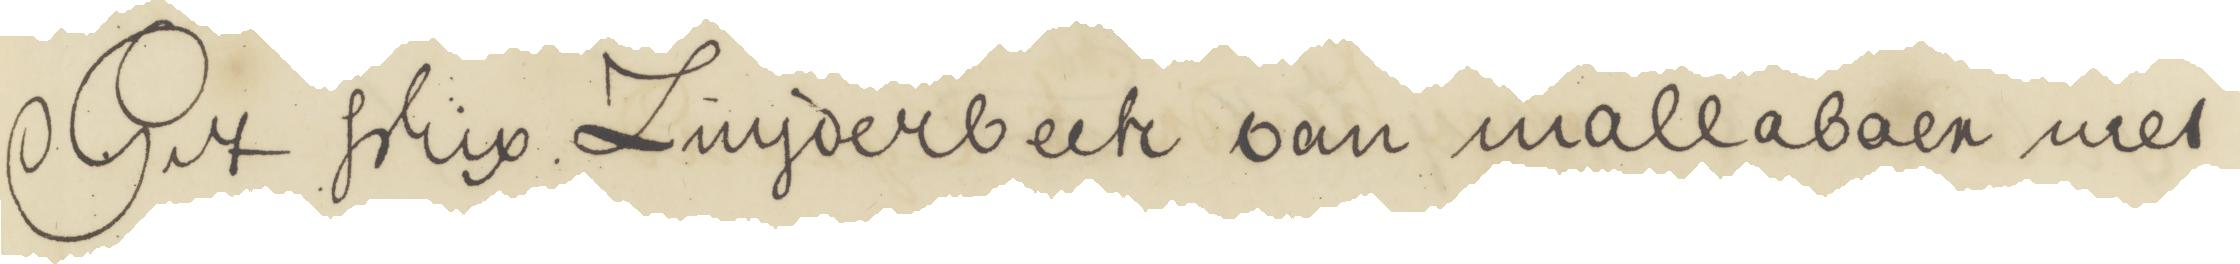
Het schip Zuyderbeek van mallabaer met
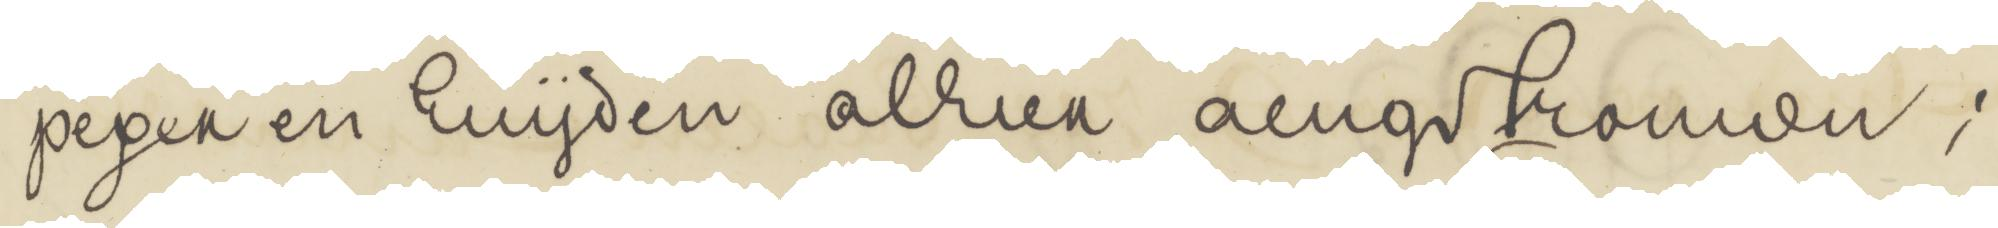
peper en huijden alhier aengekomen;
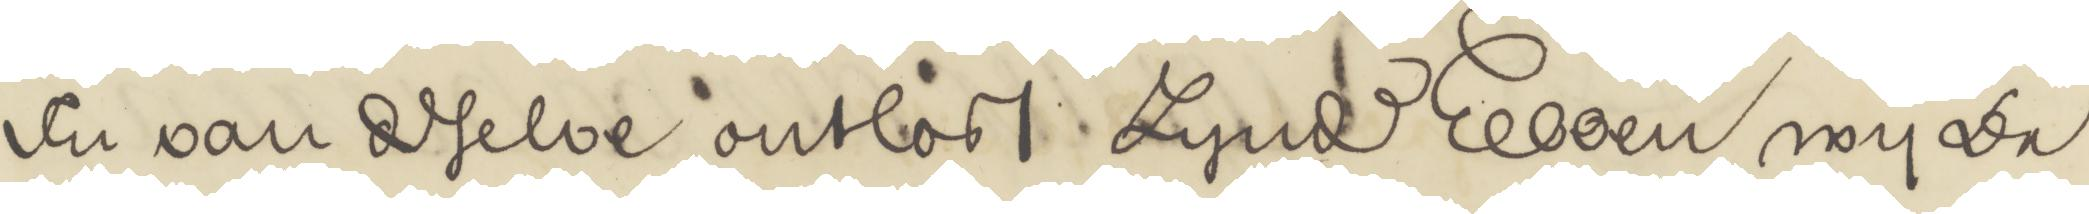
En van deselve ontlost zynde hebben wij ter
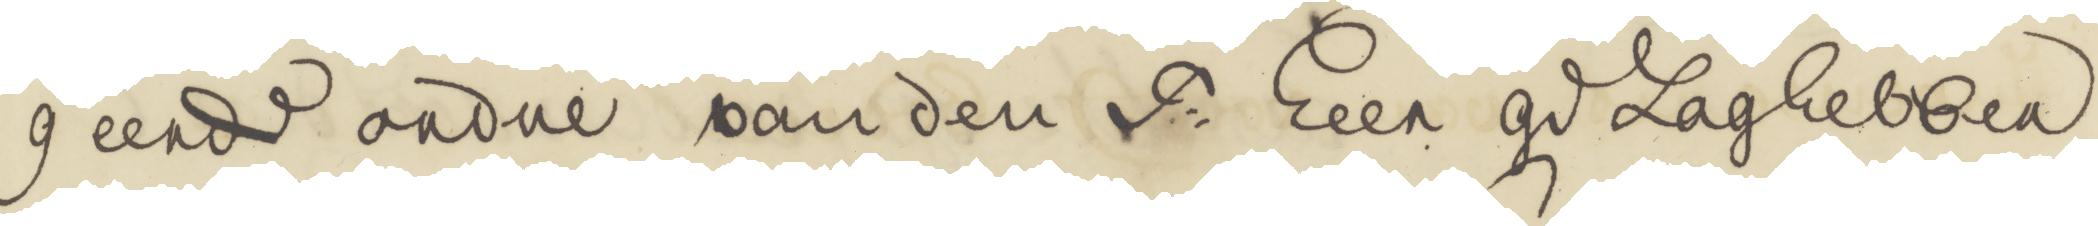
g’eerde ordre van den E: heer gezaghebber
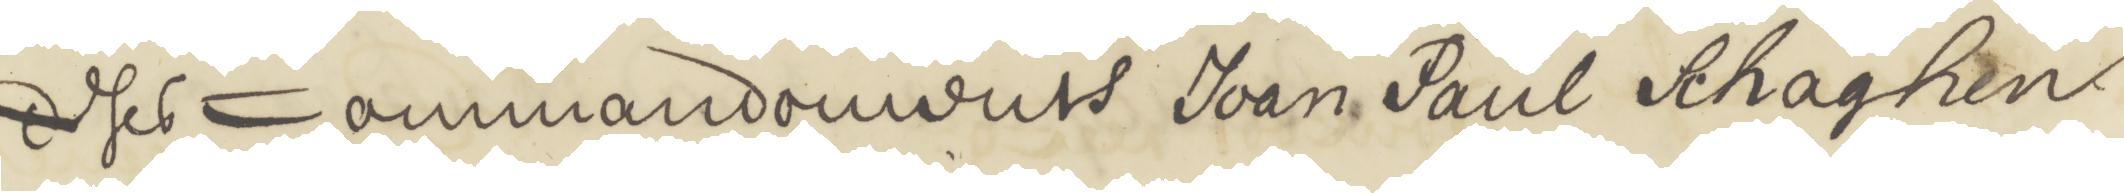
deses Commandoments Ioan Paul schaghen
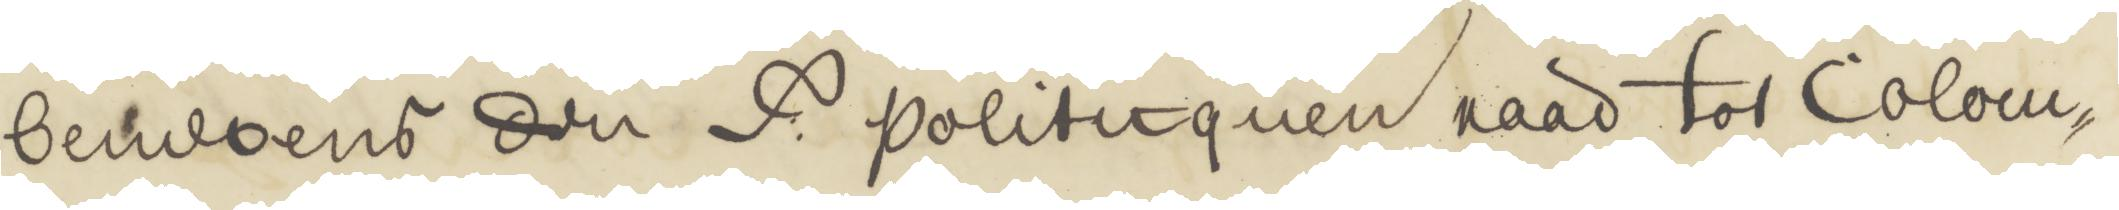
benevens den E: politicquen raad tot Colom„
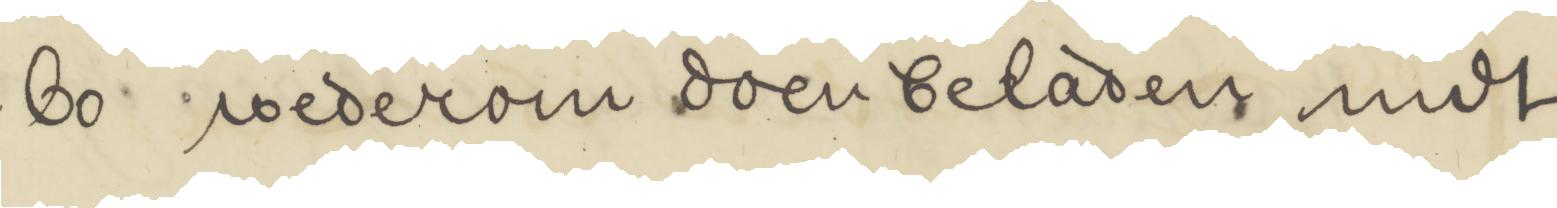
bo wederom doen beladen met
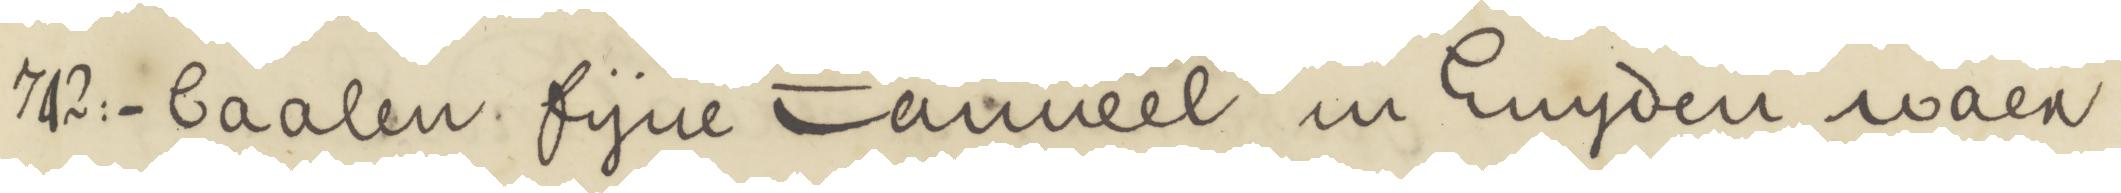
742:– baalen fijne Canneel in huyden waer
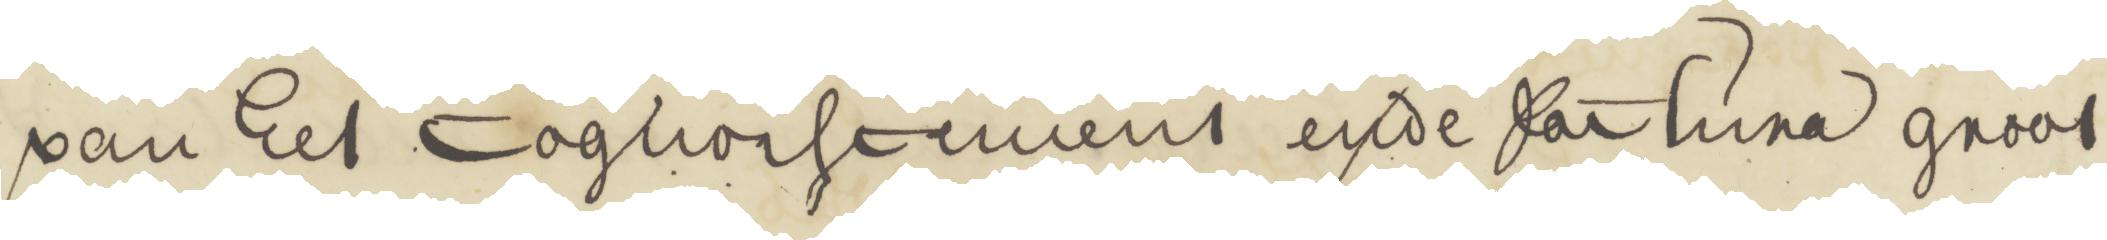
van het Cognoiscement ende factura groot
